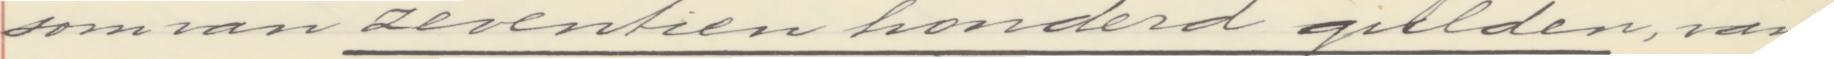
som van zeventien honderd gulden, van
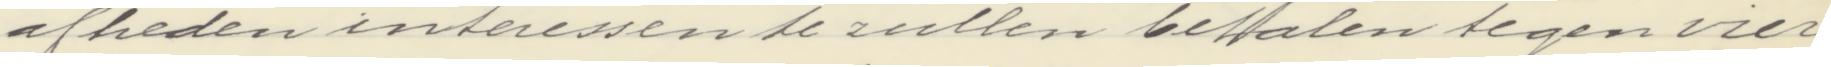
af heden interessen te zullen betalen tegen vier
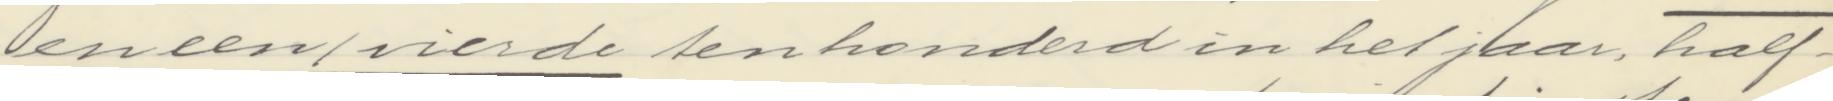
en een / vierde ten honderd in het jaar, half
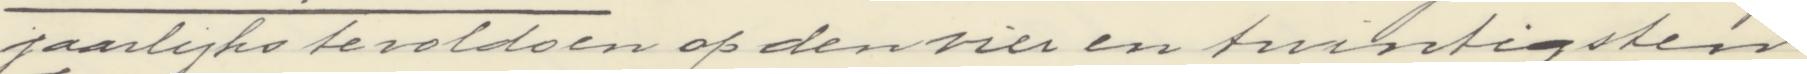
jaarlijks te voldoen op den vier en twintigsten
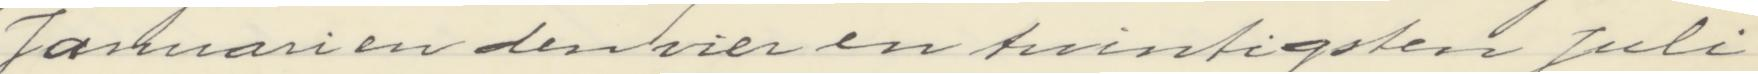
Januari en den vier en twintigsten Juli
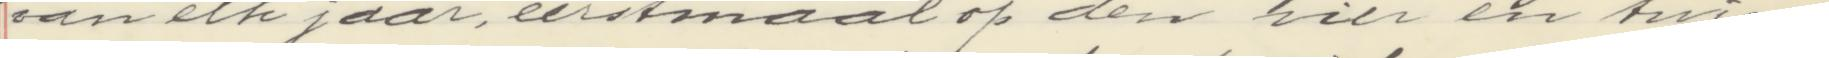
van elk jaar, eerstmaal op den vier en twin-
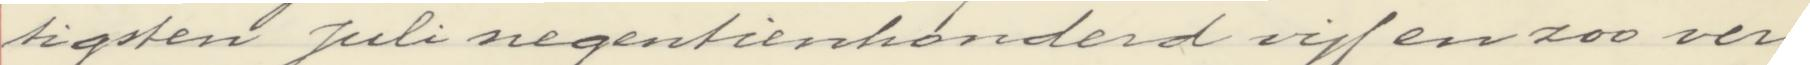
tigsten Juli negentienhonderd vijf en zoo ver
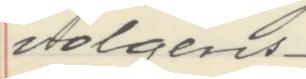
volgens
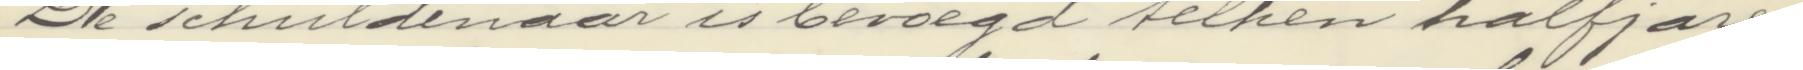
De schuldenaar is bevoegd telken halfjare
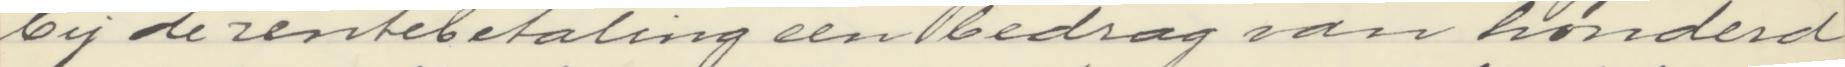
bij de rentebetaling een bedrag van honderd
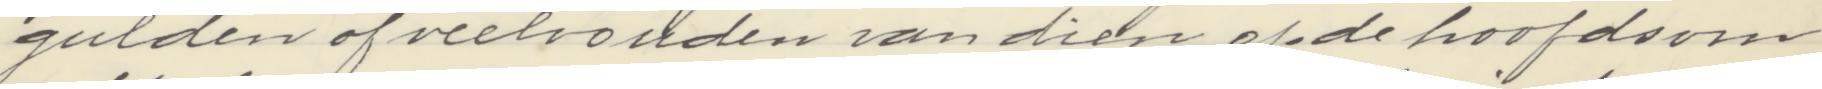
gulden of veelvouden van dien op de hoofdsom
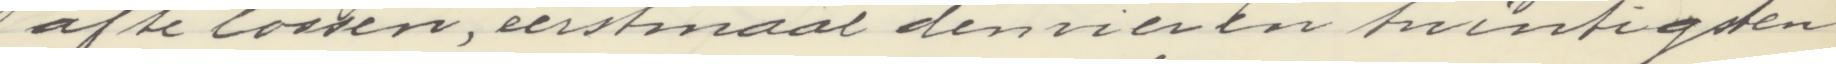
af te lossen, eerstmaal den vier en twintigsten
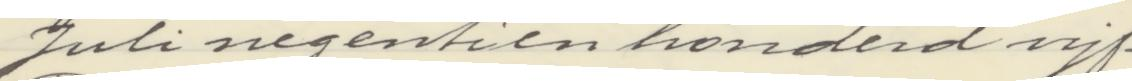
Juli negentien honderd vijf
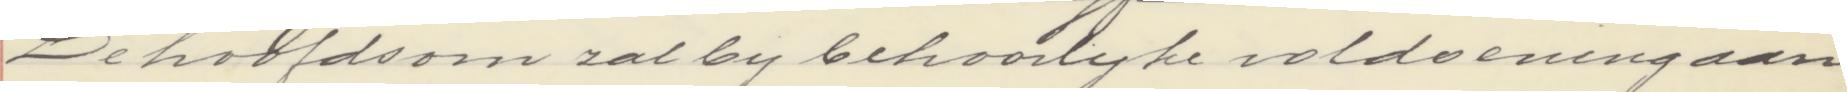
De hoofdsom zal bij behoorlijke voldoening aan
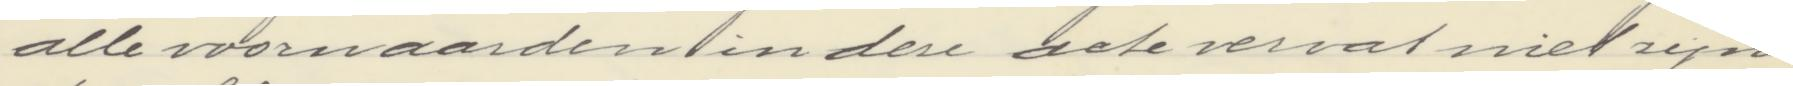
alle voorwaarden in deze acte vervat niet zijn
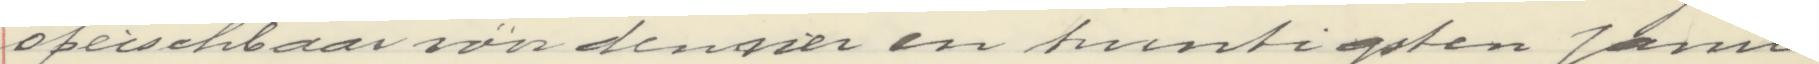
opeischbaar voor den vier en twintigsten Janu
